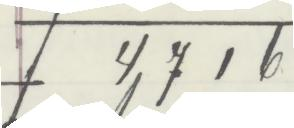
ƒ 4716
